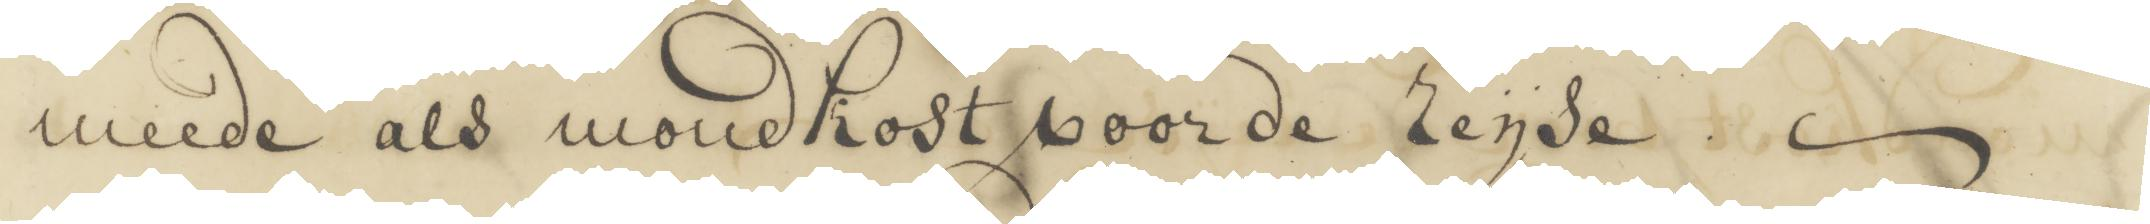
meede als mondkost voor de reijse.—
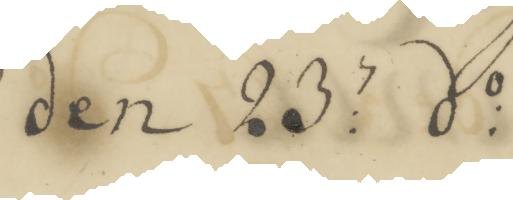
den 23:' d:o
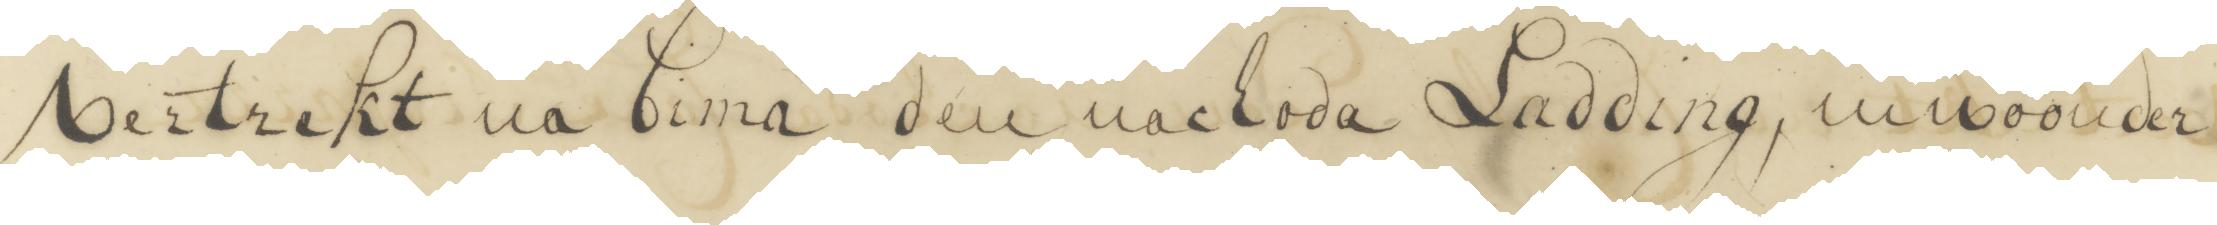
vertrekt na bima den nachoda Ladding, inwoonder
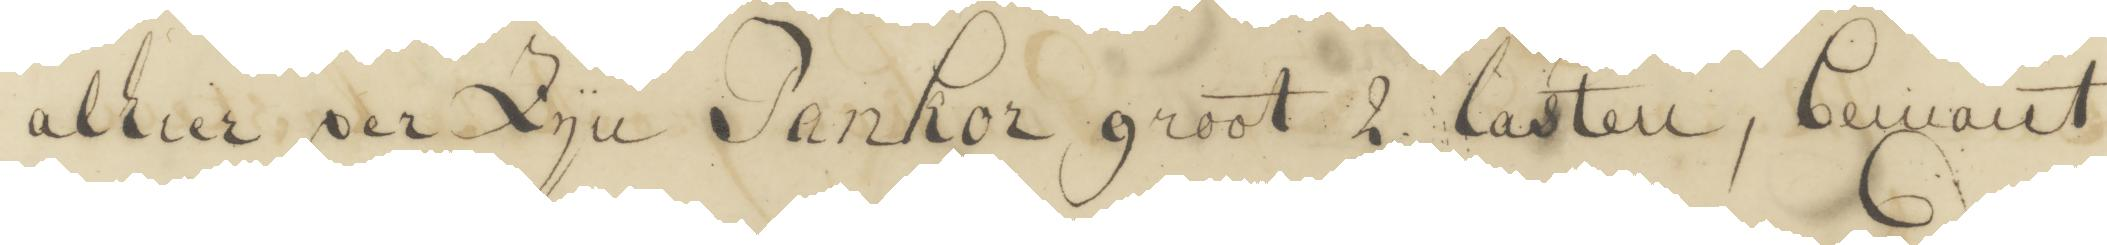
alhier per zijn Pankor groot 2. lasten, bemant
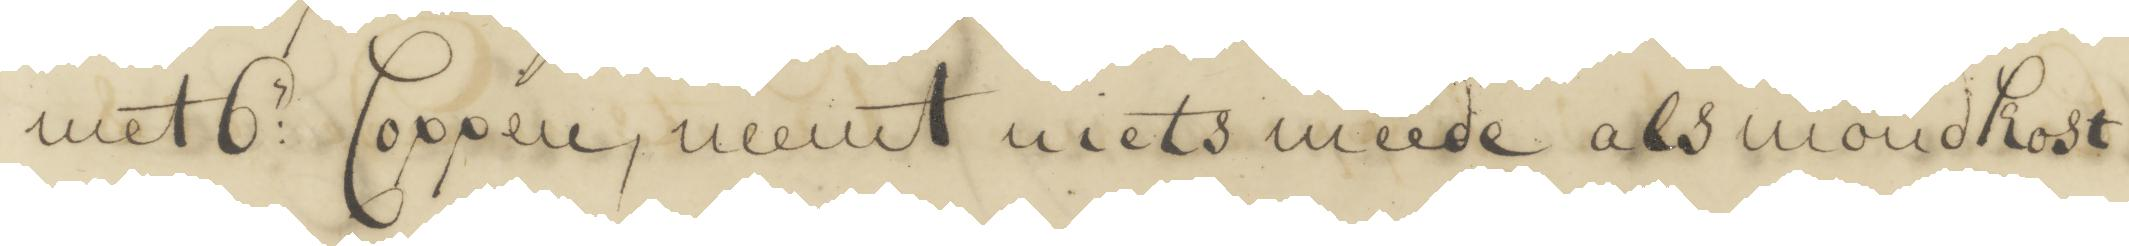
met 6:' Coppen, neemt niets meede als mondkost
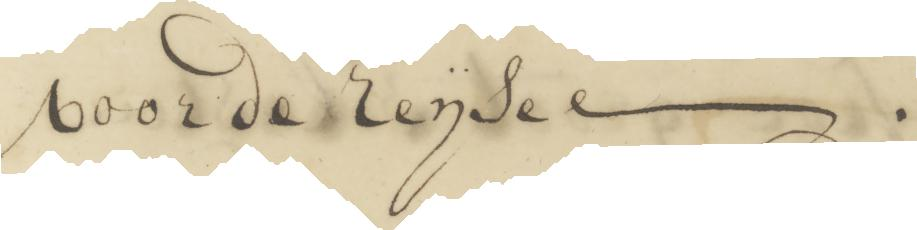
voor de reijse—.
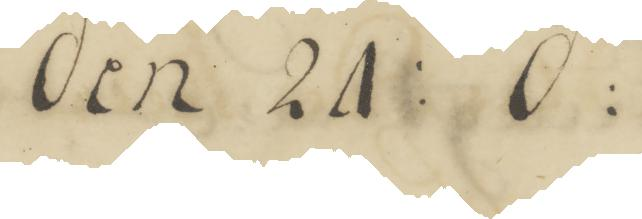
den 24:' d:o
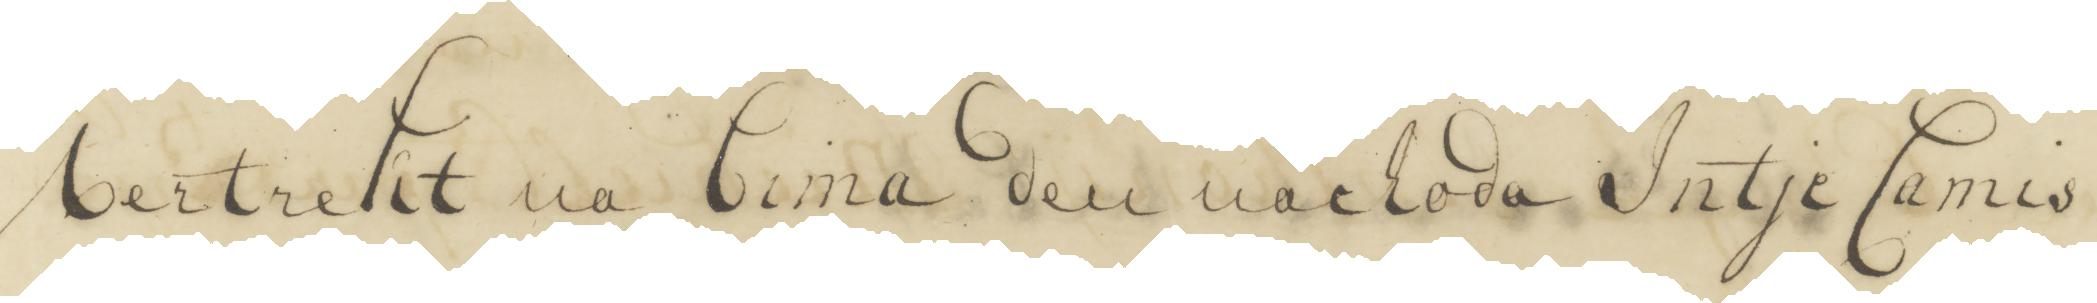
vertrekt na bima den nachoda Intje Camis
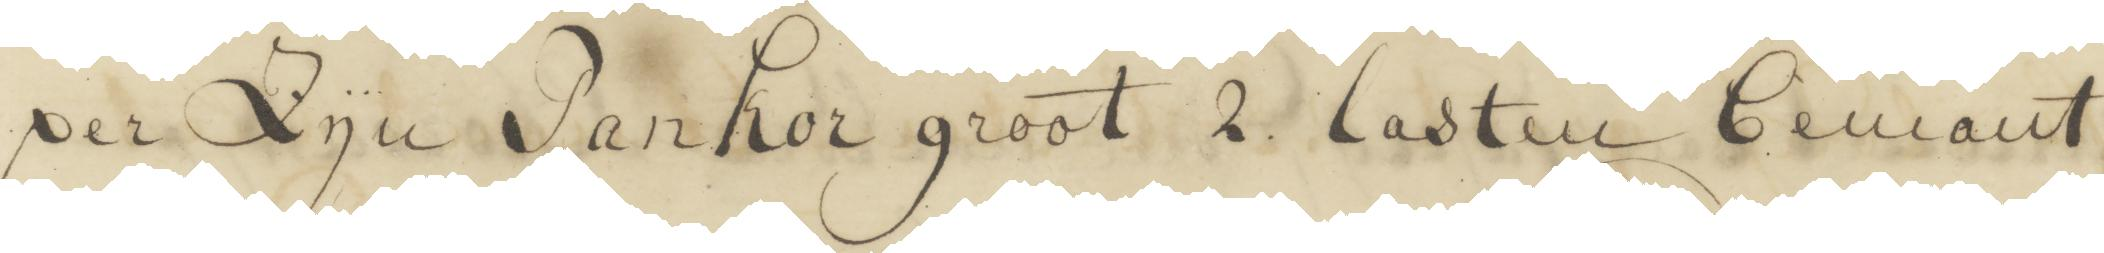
per zijn Pankor groot 2. lasten bemant
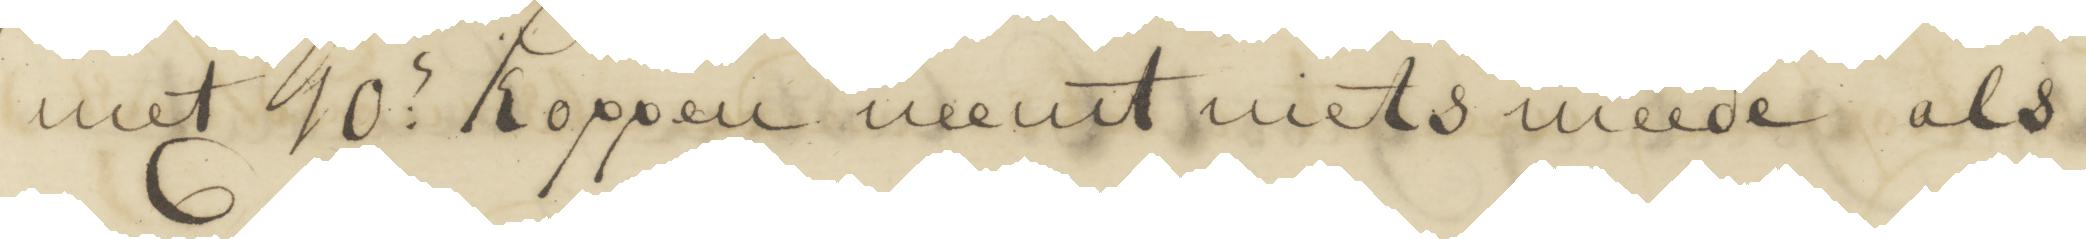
met 10:' koppen neemt niets meede als
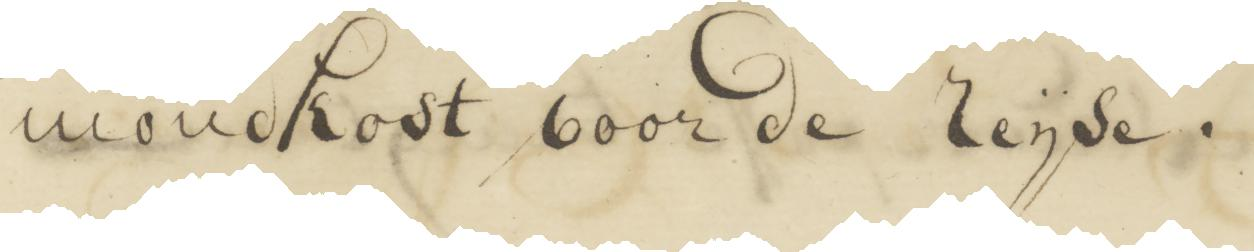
mondkost voor de reijse.
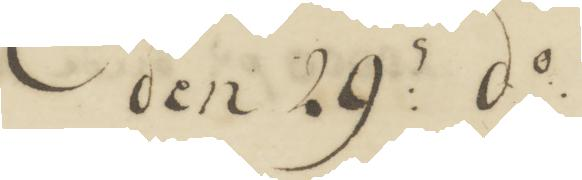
den 29:' d:o
